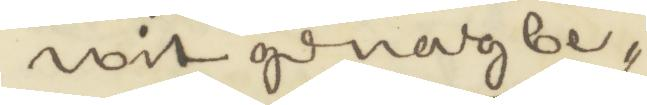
wit genoeg be„
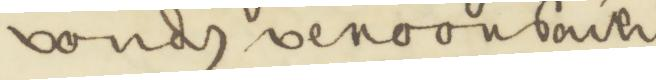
vonden veroorsaekt
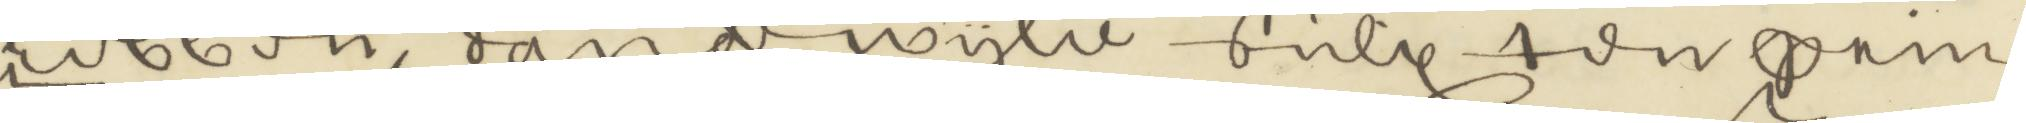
hebben, dan de wijle sulx ten prin
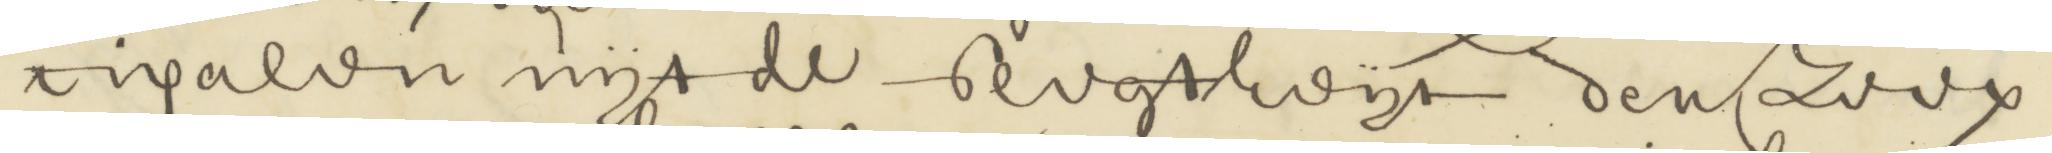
cipalen uijt de slegtheijt der zeep
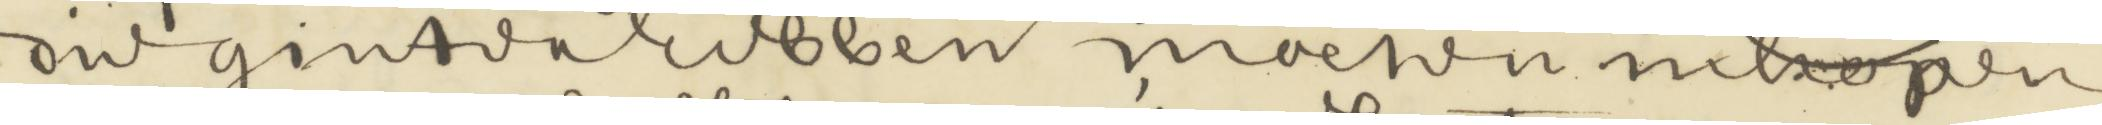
die ginter hebben moeten inkopen
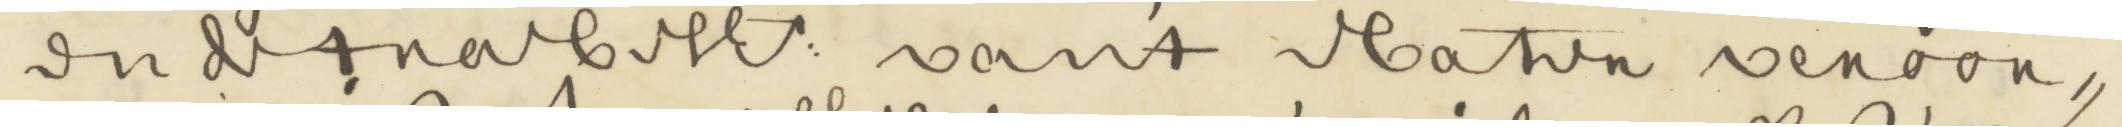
en de troebelh:t van't water veroor„
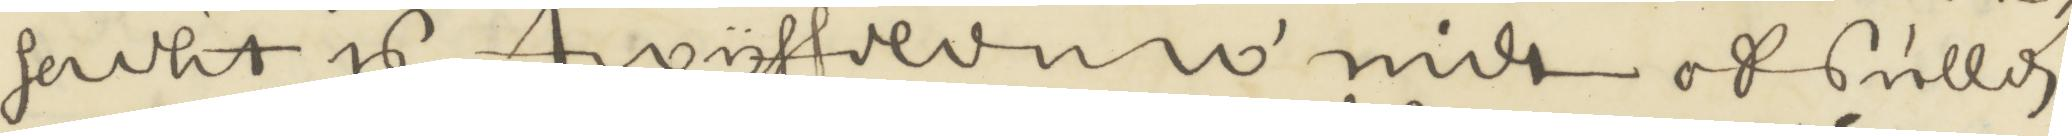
saekt is, twijffelen w' niet of sullen
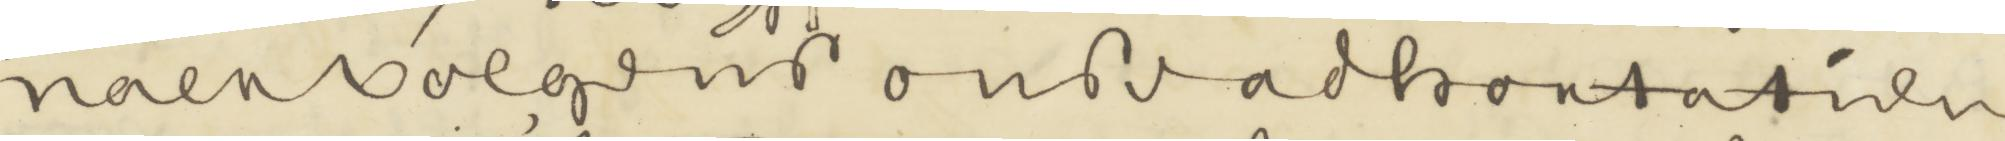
naer volgens onse adhortatien
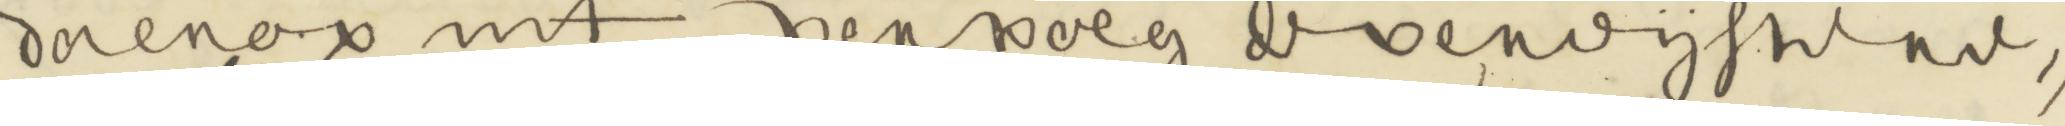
daerop in't vervolg de vereijste re„
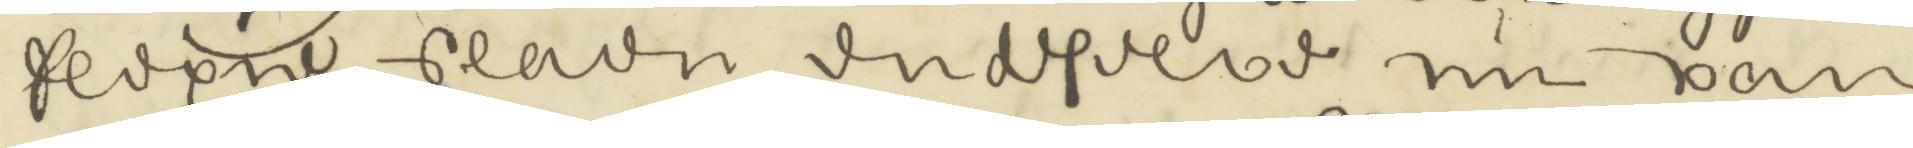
flexie slaen en deselve nu van
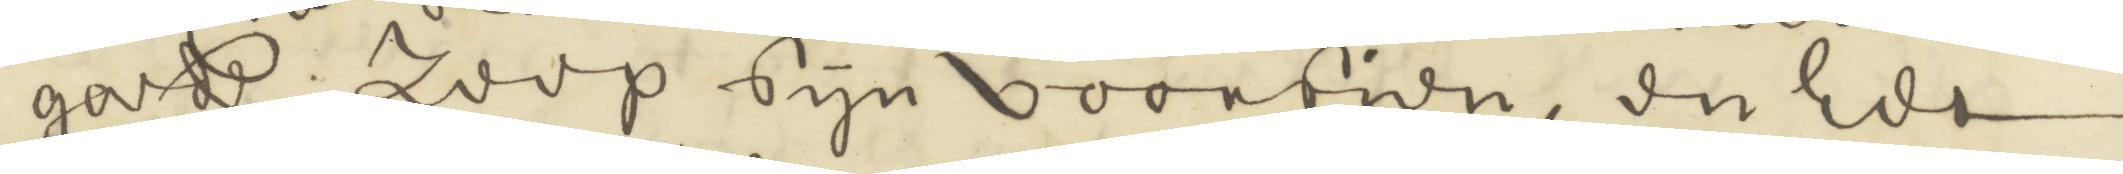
goede zeep sijn voorsien, en het
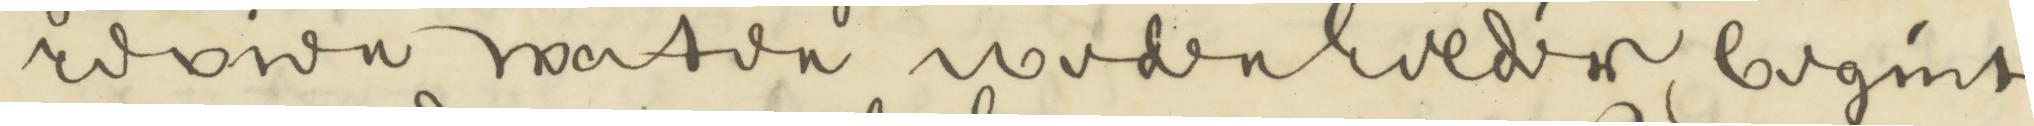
revier water weder helder, begint
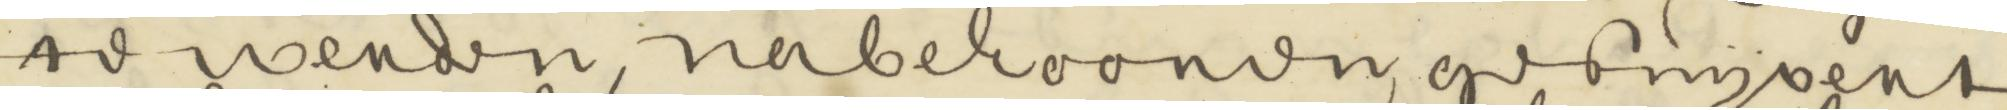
te werden, nabehooren gesuijvert
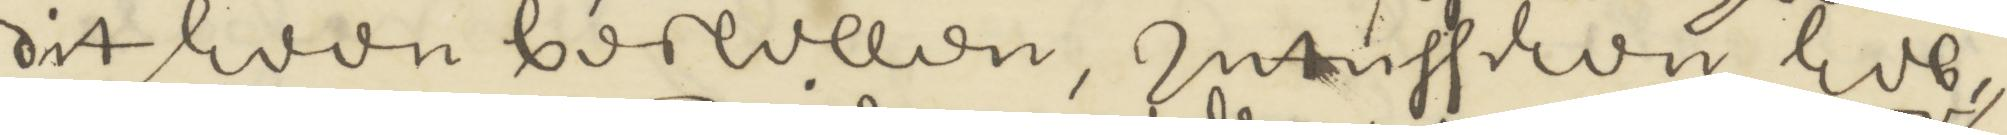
dit heen bestellen, jntusschen heb„
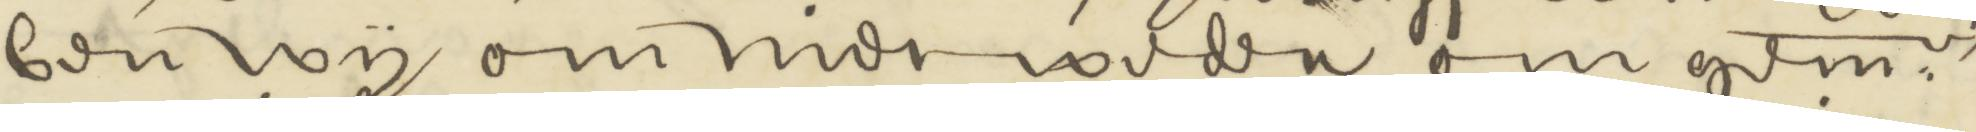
ben wij om met weder om gem:
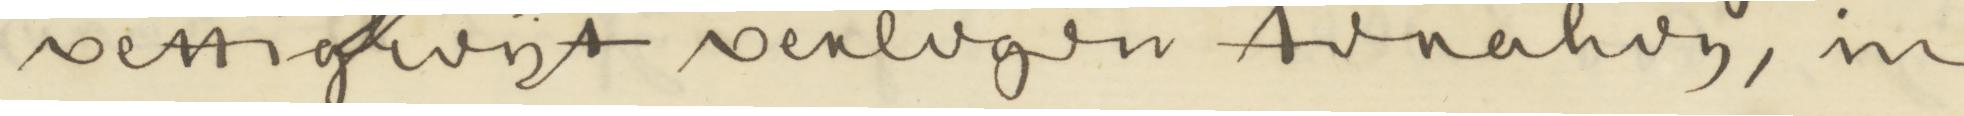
vettigheijt verlegen teraken, in
